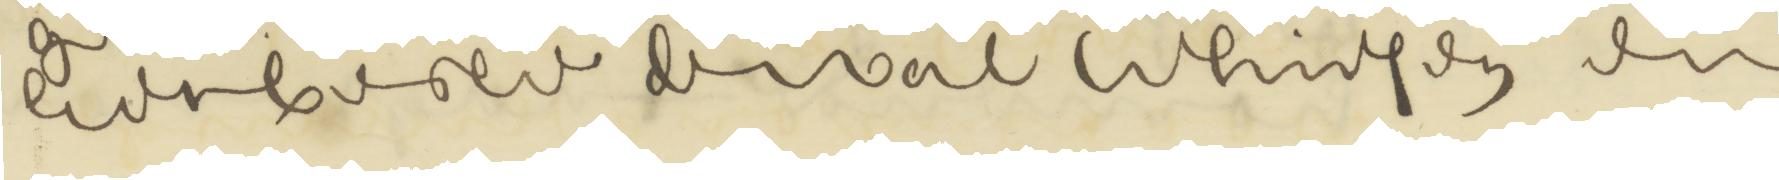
het beste de wal tekiesen en
